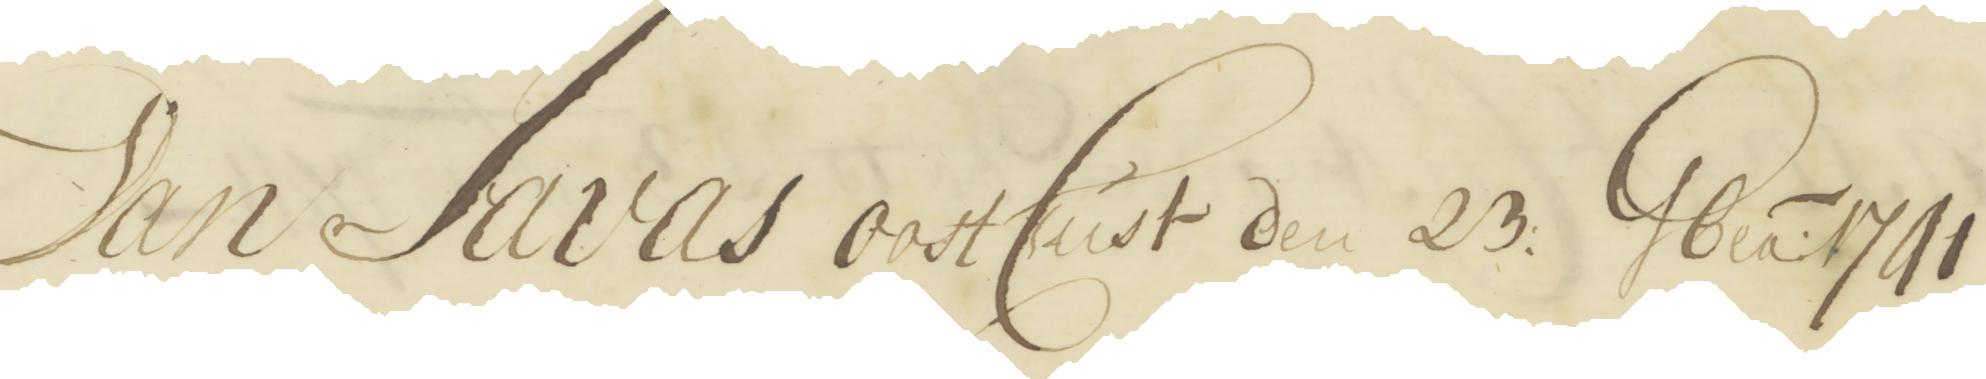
Van Javas oost Cust den 23: 9ber: 1741
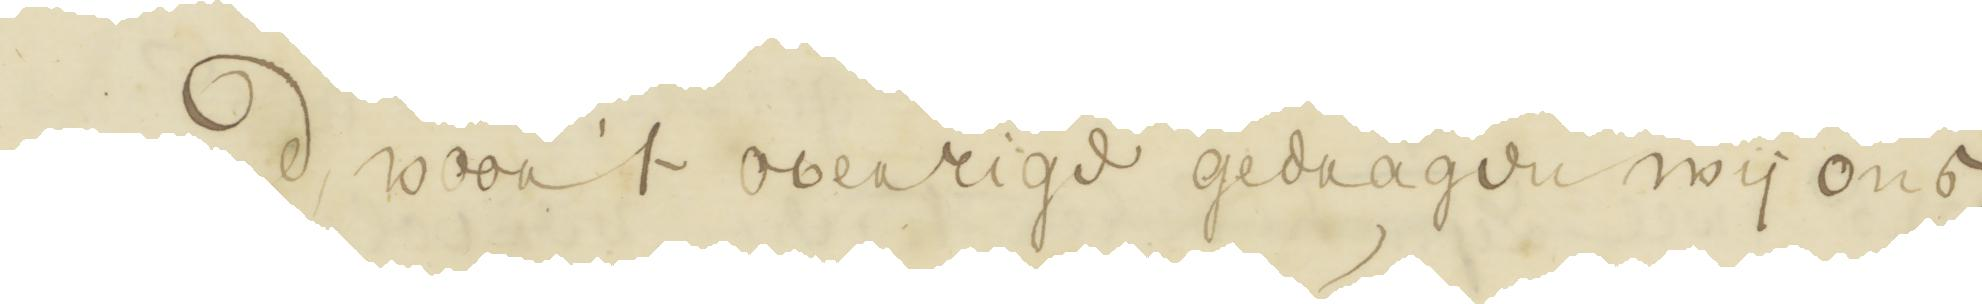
wierd, voor ’t overrige gedragen wij ons,
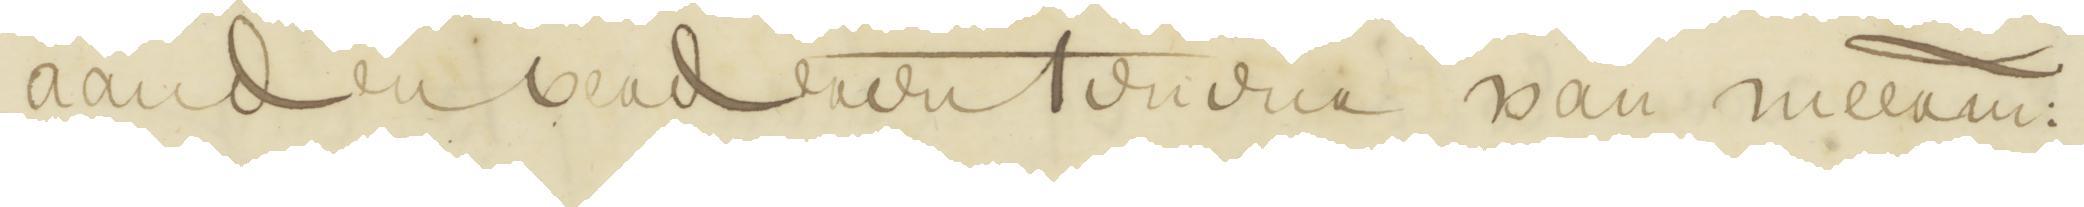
aan den verderen teneur van meerm:
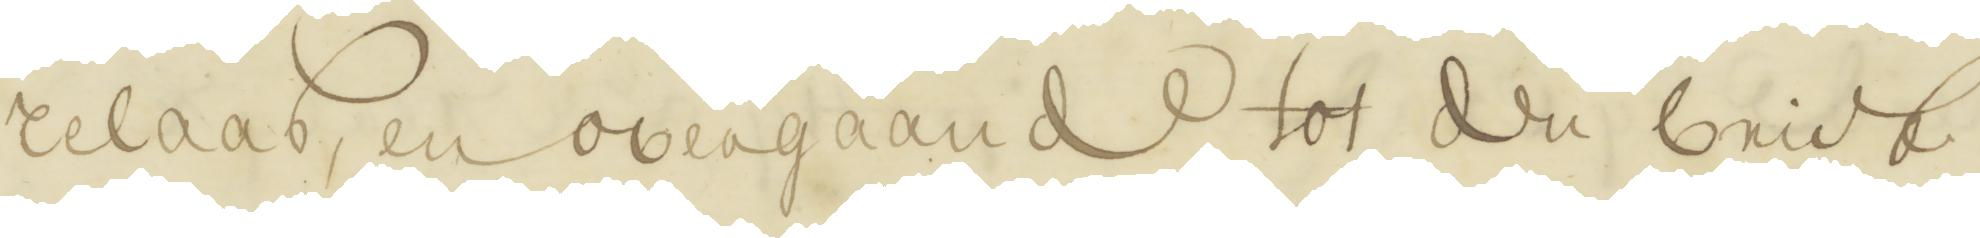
relaas, en overgaande tot den brief
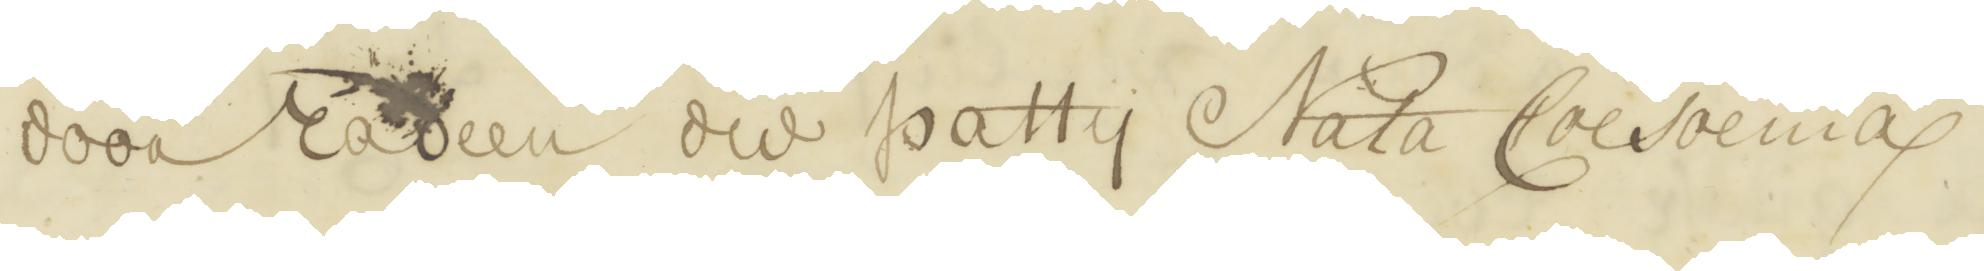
door radeen die pattij Nata Coesoema
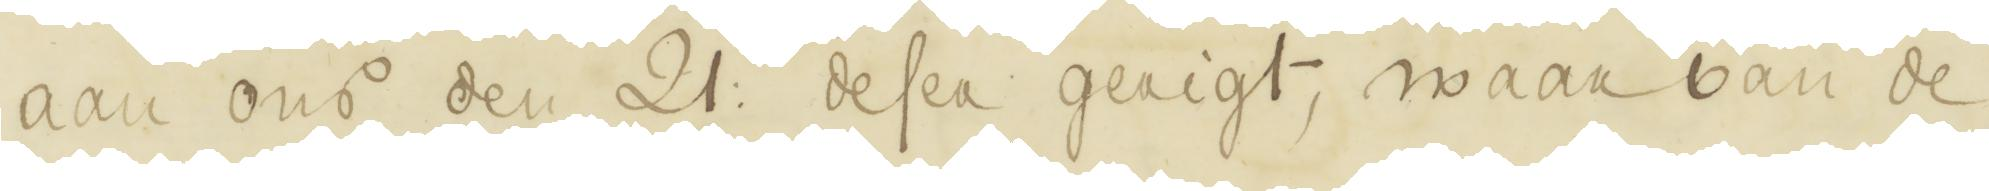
aan ons den 21: deser gerigt, waarvan de
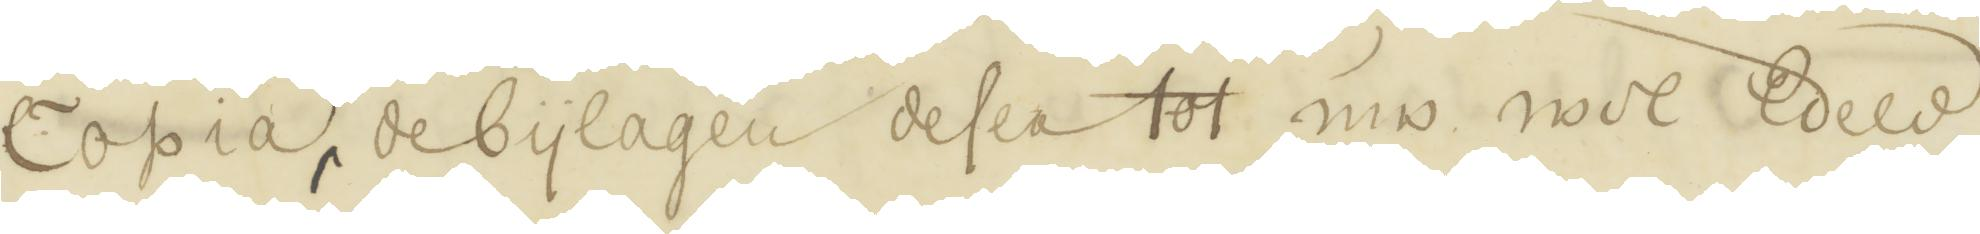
Copia ^ de bijlagen deser tot uw wel Edele
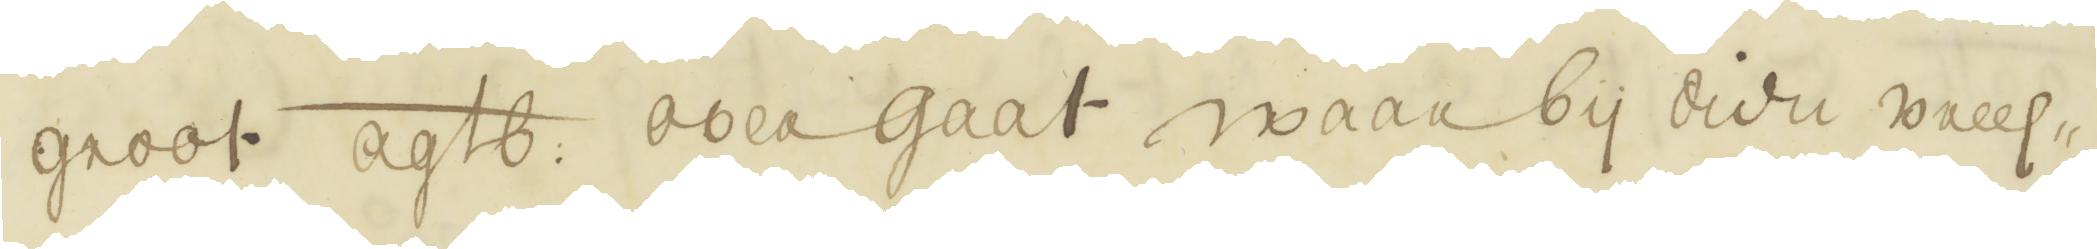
groot agtb: over gaat waar bij dien vrees„
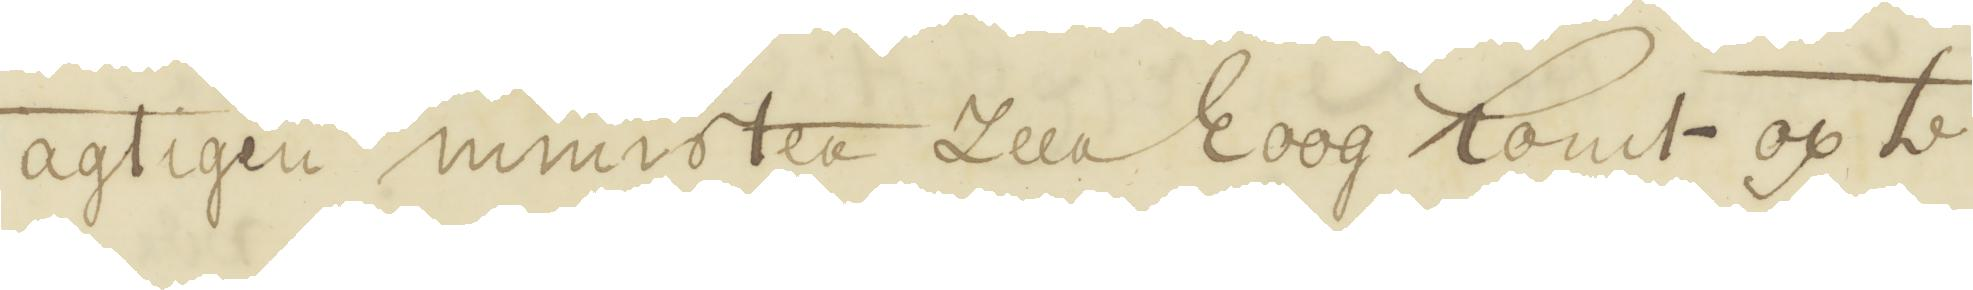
agtigen minister zeer hoog komt op te
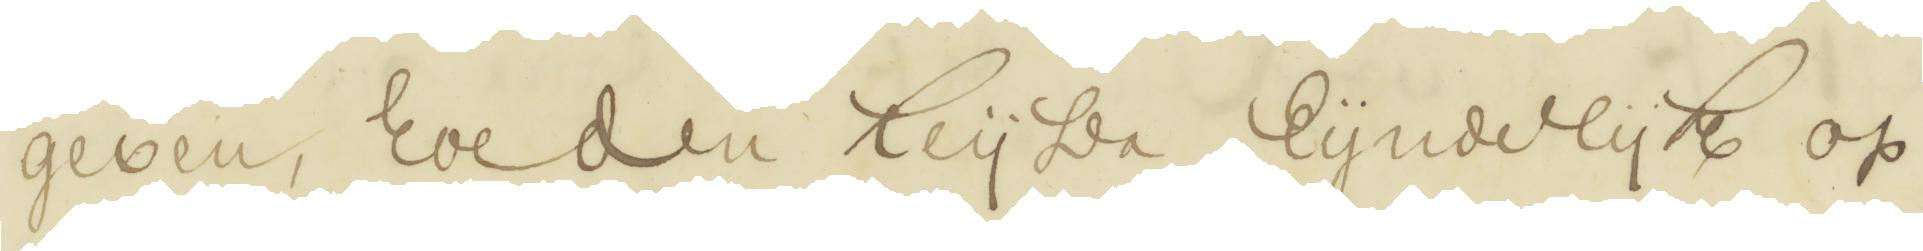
geven, hoe den keijser Eijndelijk op
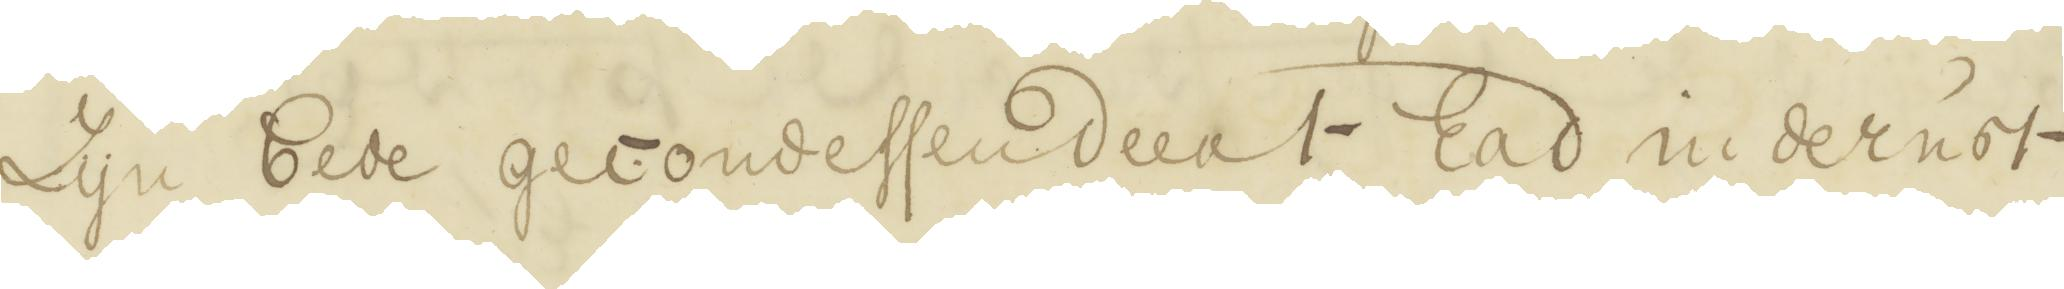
zijn bede gecondessendeert had in de rust
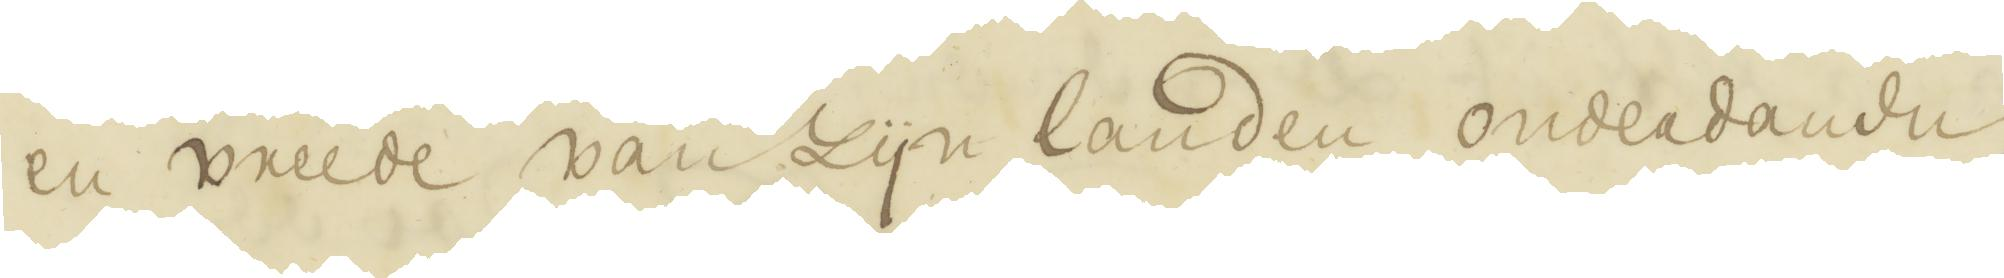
en vreede van zijn landen onderdanen
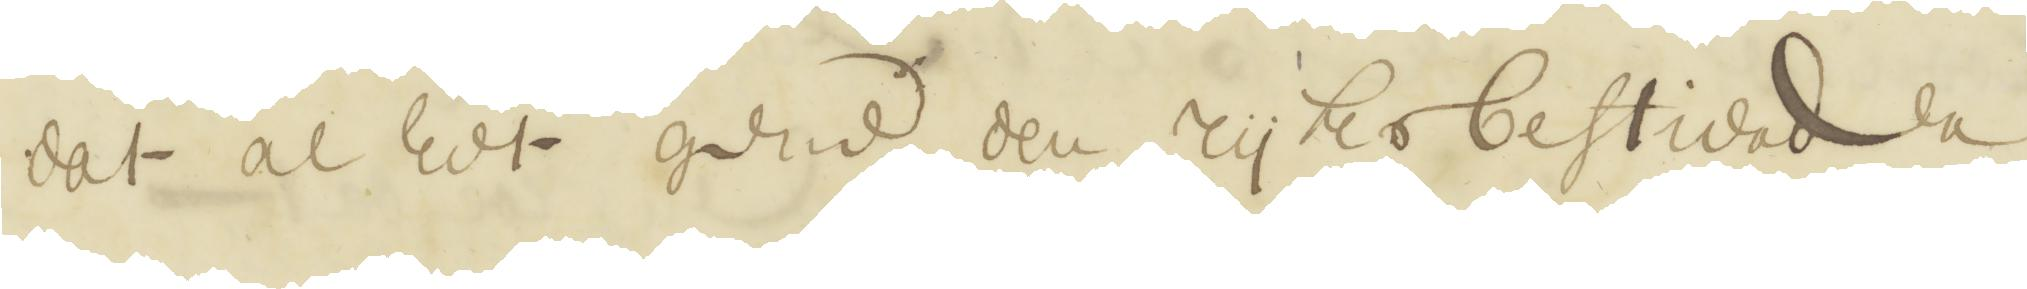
dat al het gene den rijksbestierder
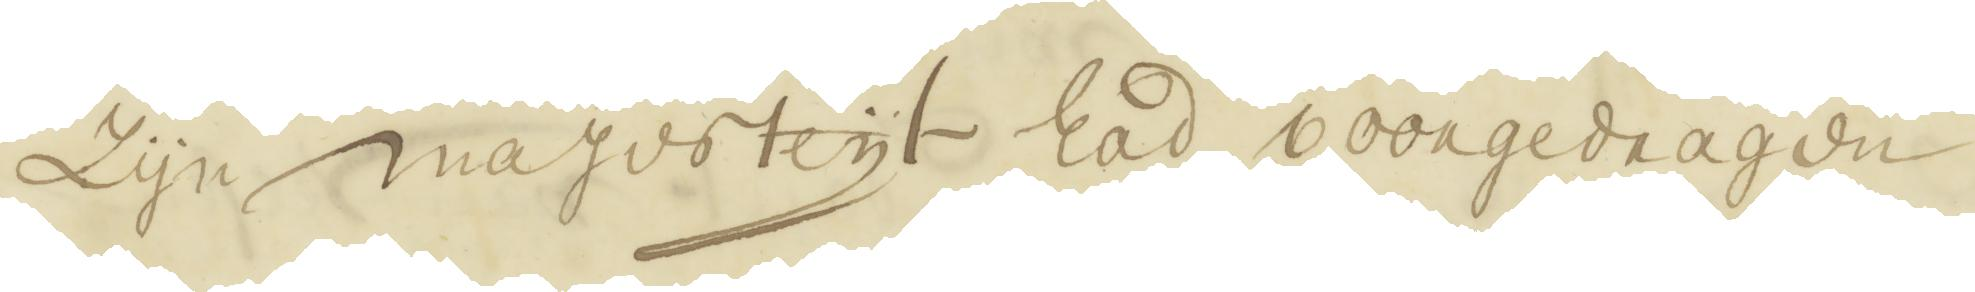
zijn majesteijt had voorgedragen
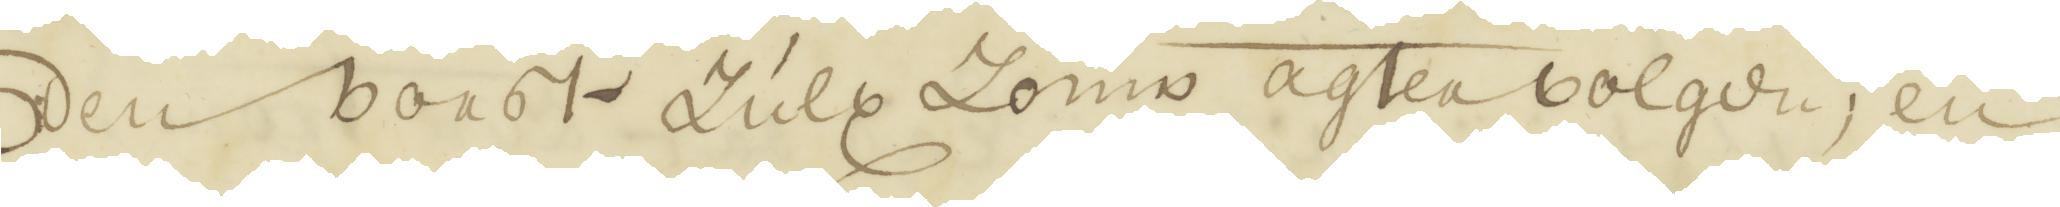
den vorst zulx zouw agtervolgen; en
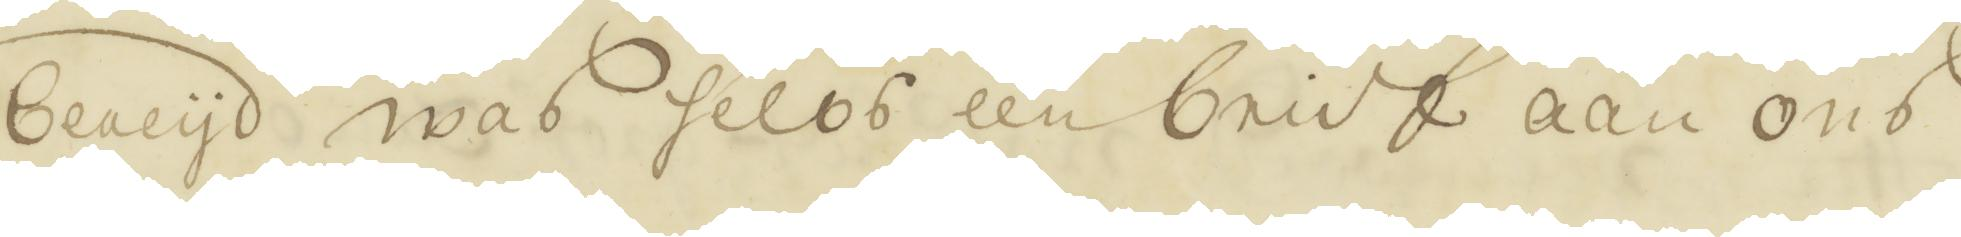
bereijd was selvs een brief aan ons
